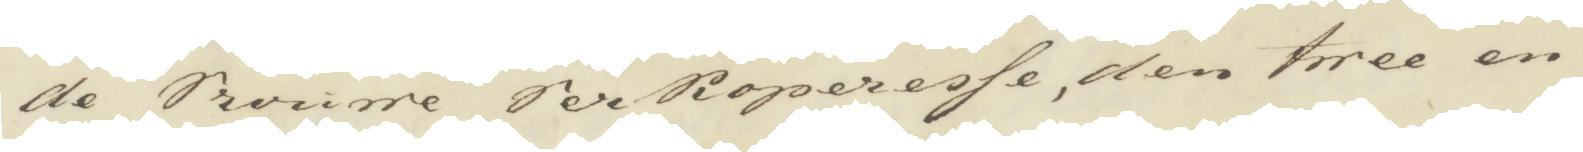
de Vrouwe Verkoperesse, den twee en
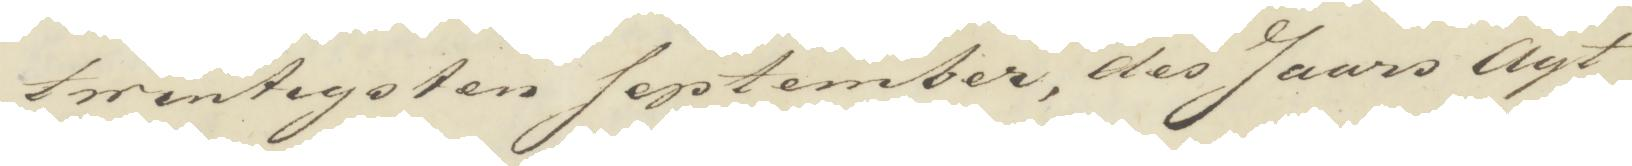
twintigsten september, des Jaars Agt
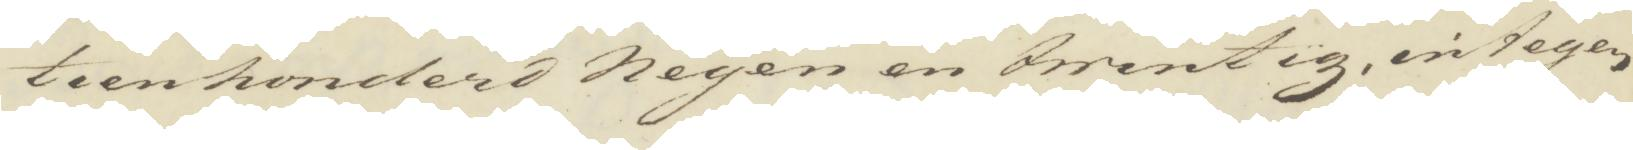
tien honderd negen en twintig, in tegen
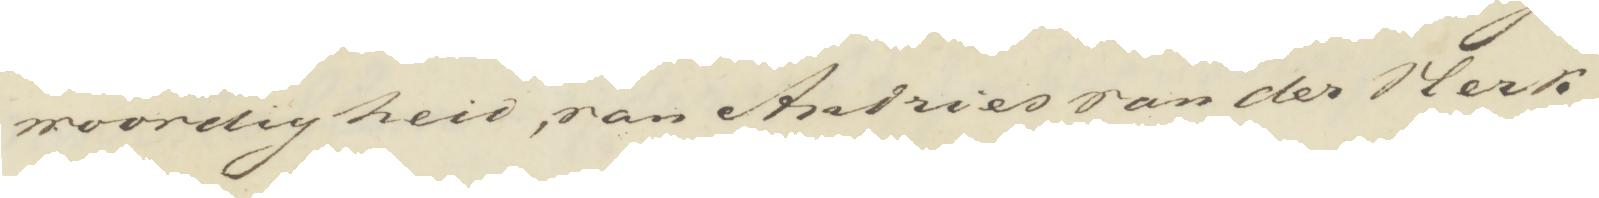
woordigheid, van Andries van der Vlerk
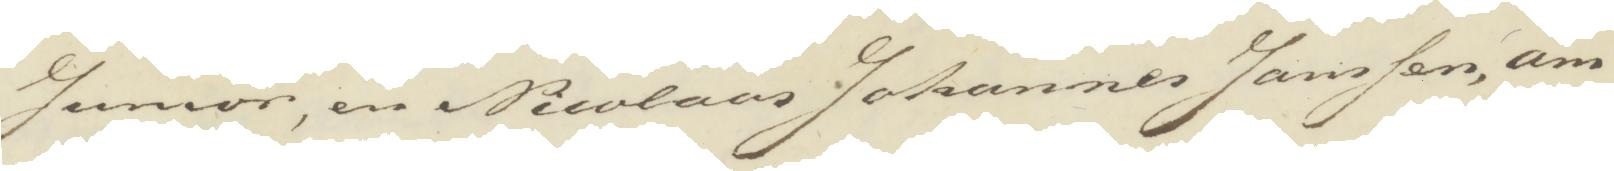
Junior, en Nicolaas Johannes Janssen, am
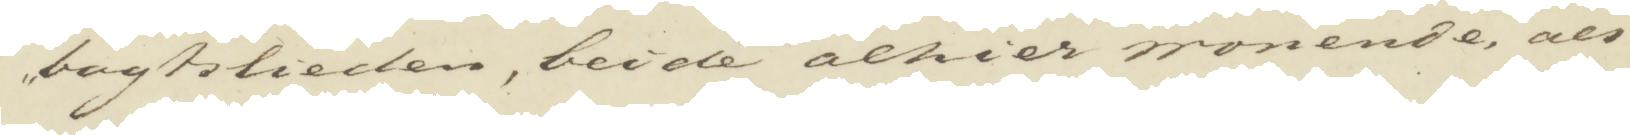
„bagtslieden, beide alhier wonende, als
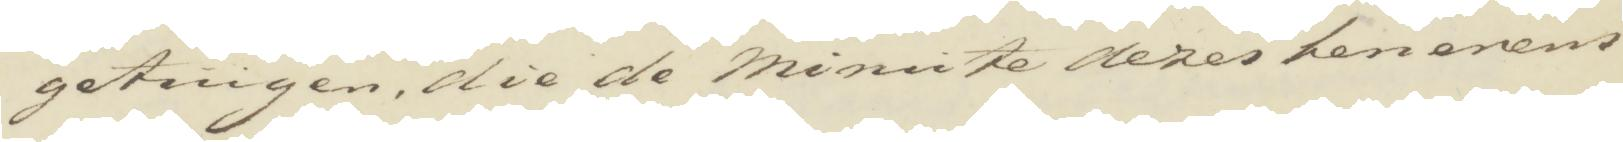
getuigen, die de minute dezes benevens
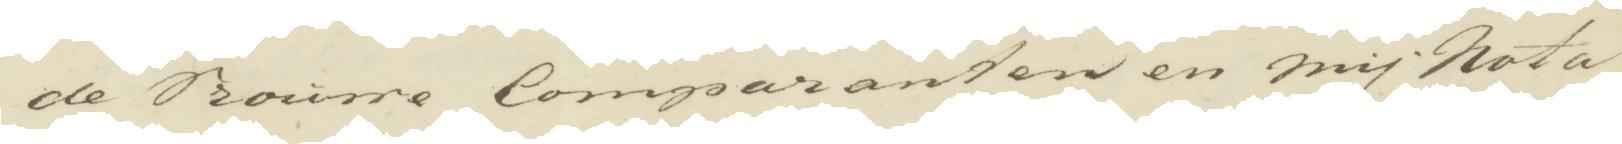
de Vrouwe Comparanten en mij Nota
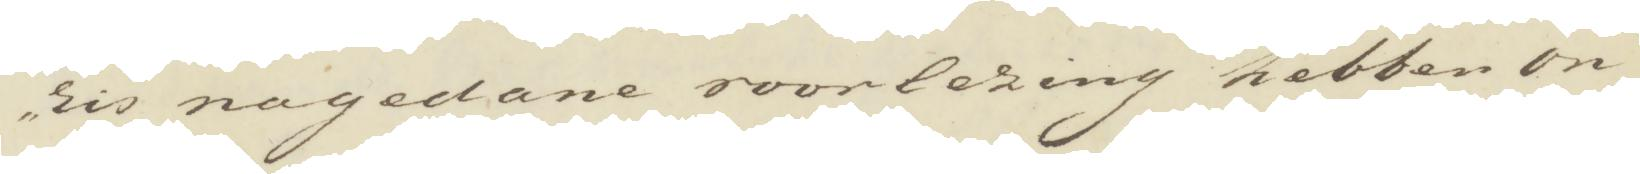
„ris na gedane voorlezing hebben on
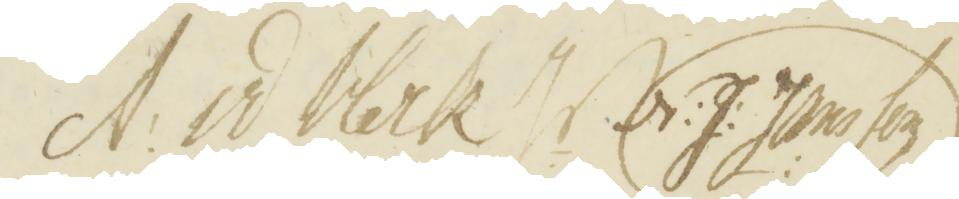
A: vd Vlerk J_r N:J: Janssen
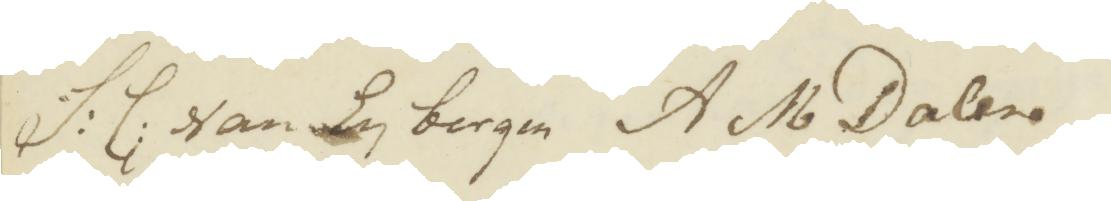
S: C: van Eybergen A M Dalen
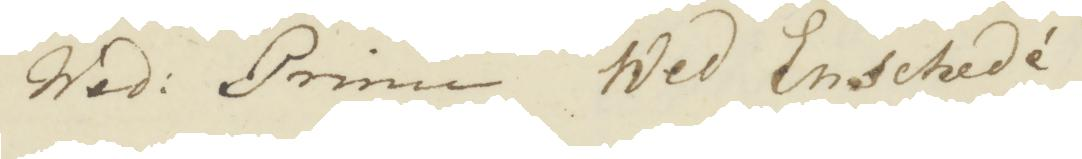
Wed: Prince Wed Enschedé
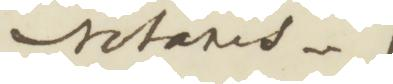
Notaris _
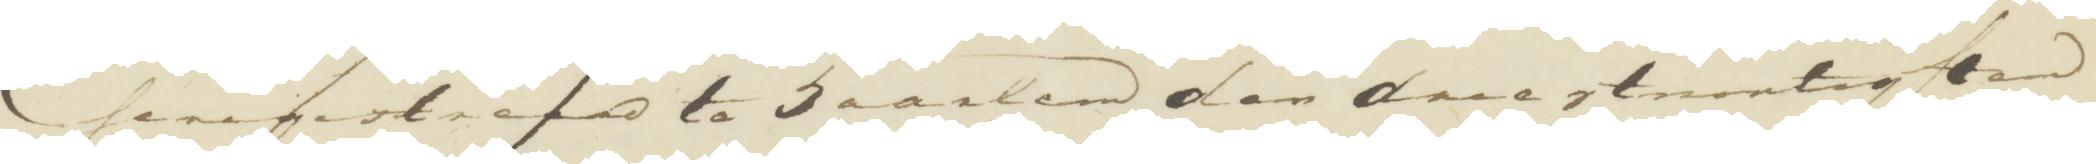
Geregistreerd te Haarlem den drieentwintigsten
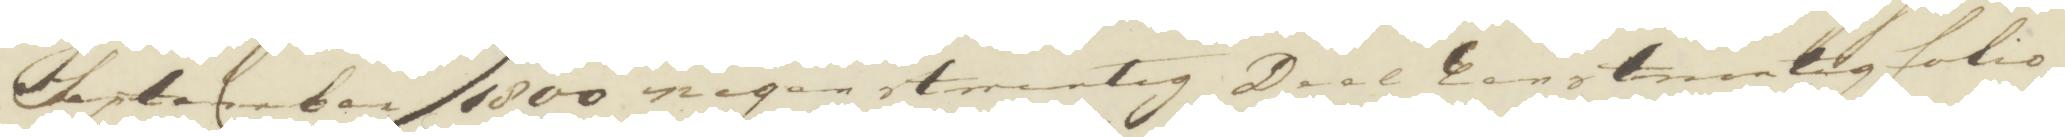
September 1800 negenentwintig Deel Eenentwintig folio
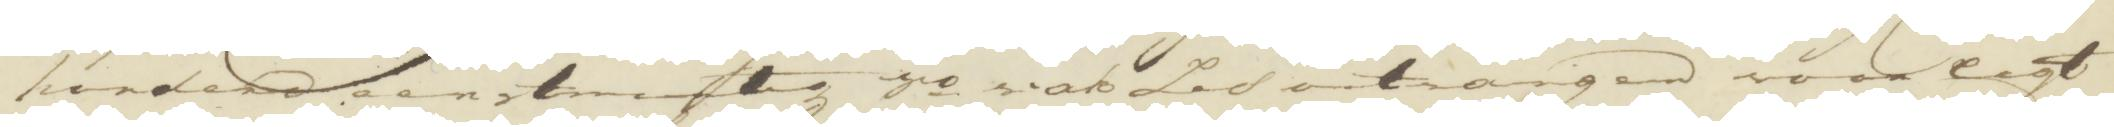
honderd eenentvijftig d_o vak Zes ontvangen voor regt
